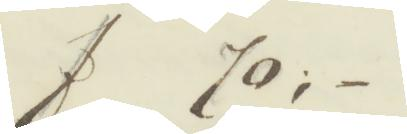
ƒ 70; —
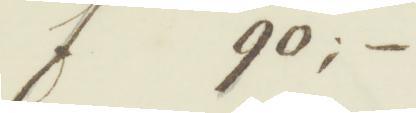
ƒ 90; —
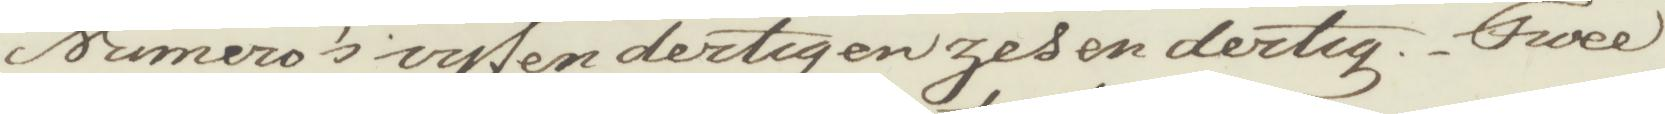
Numero's vyf en dertig en zes en dertig.- Twee
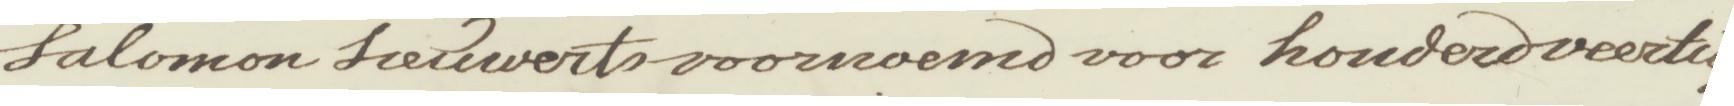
Salomon Sieuwerts voornoemd voor honderdveertig
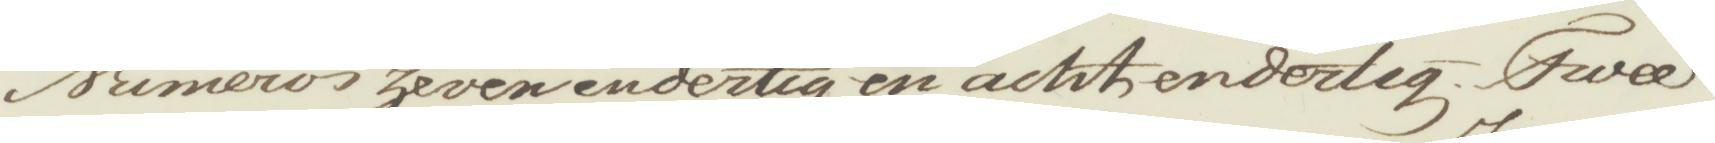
Numero's zeven endertig en acht endertig, Twee
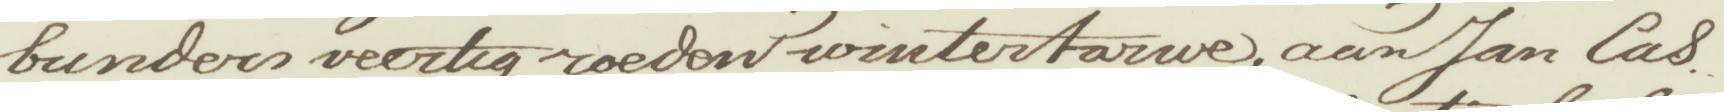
bunders veertig roeden wintertarwe, aan Jan Cas.
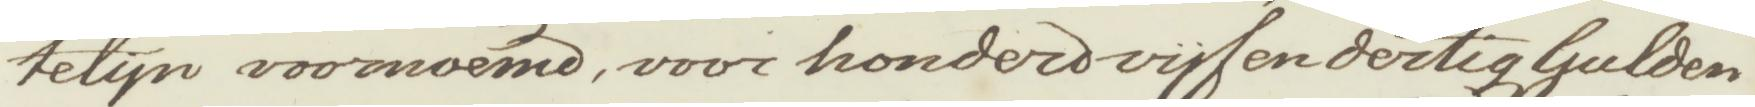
telijn voornoemd, voor honderd vijf en dertig Gulden
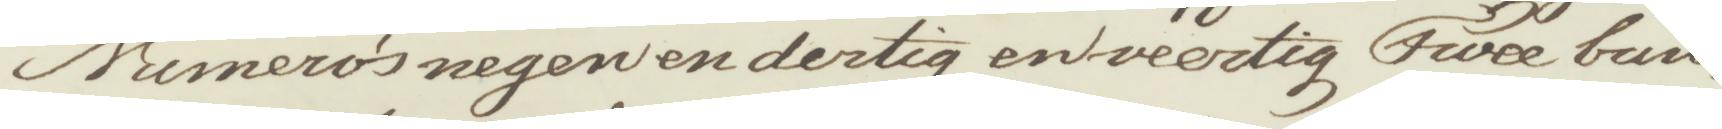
Numero's negen en dertig en veertig Twee bun
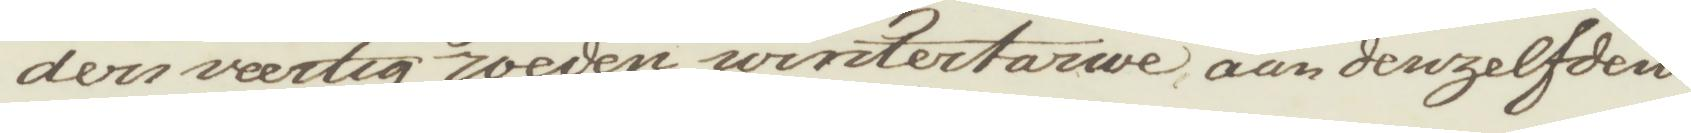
ders veertig roeden wintertarwe, aan denzelfden
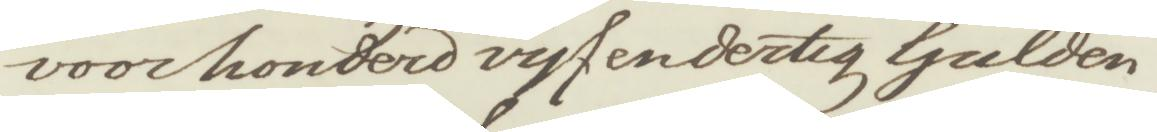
voor honderd vyf en dertig Gulden
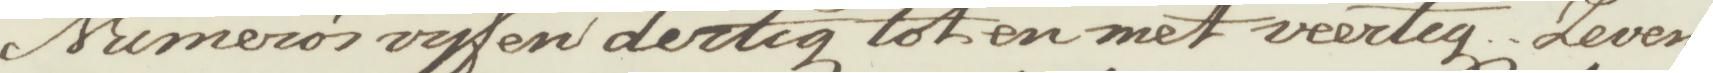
Numero's vyf en dertig tot en met veertig.- Zeven
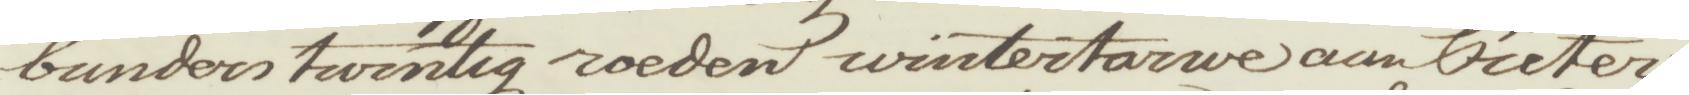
bunders twintig roeden wintertarwe aan Pieter
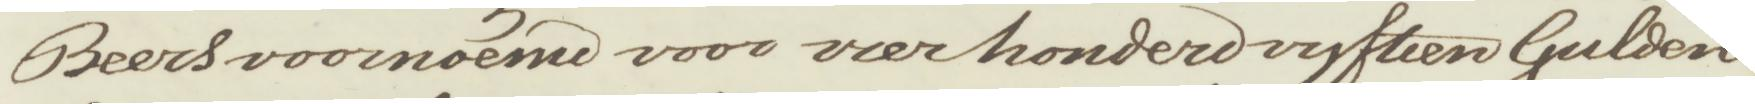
Beers voornoemd voor vier honderd vyftien Gulden
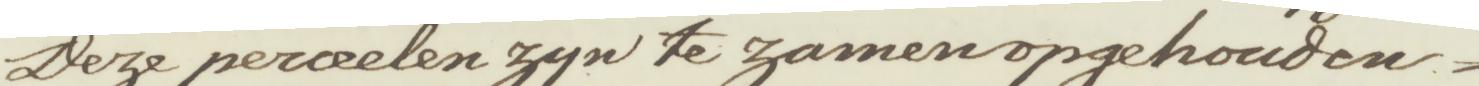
Deze perceelen zyn te zamen opgehouden.-
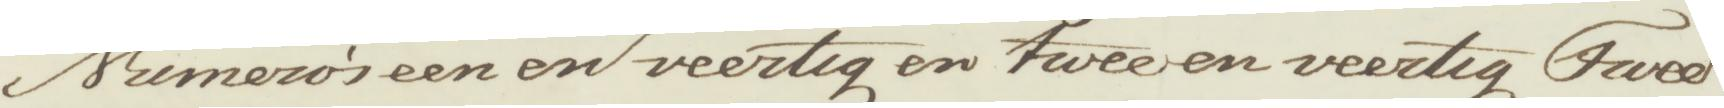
Numero's een en veertig en twee en veertig Twee
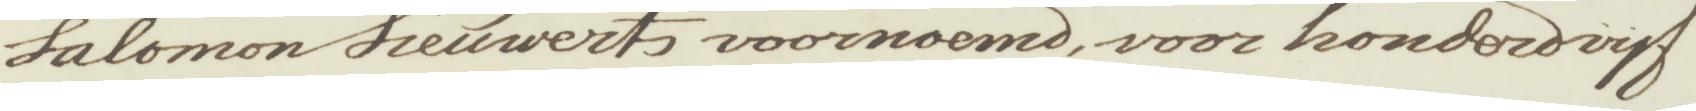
Salomon Sieuwerts voornoemd, voor honderd vyf
